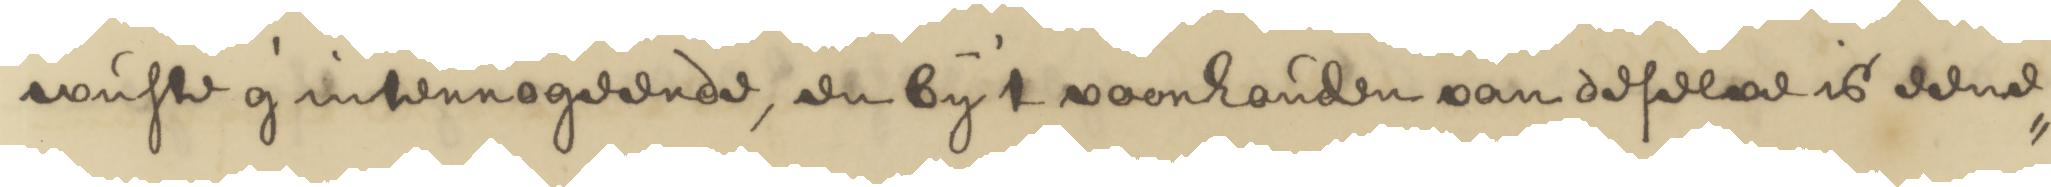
wuste g’interrogeerde, en bij ’t voorhouden van deselve is eene„
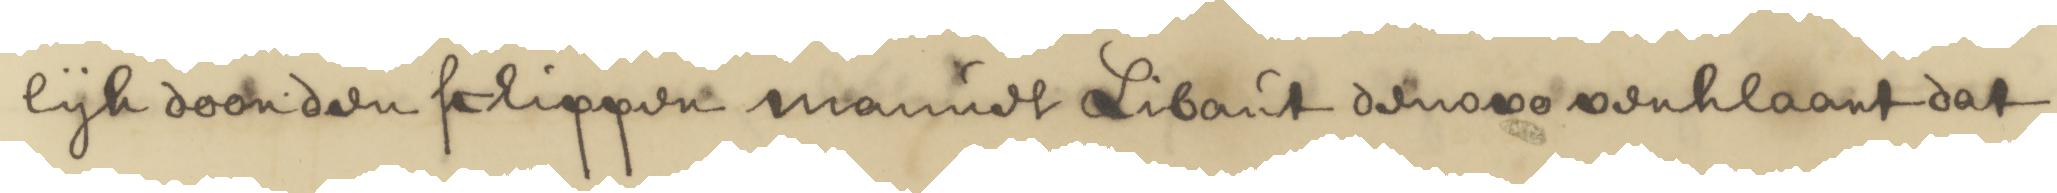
lijk door den schipper manuel Libaut denovo verklaart dat
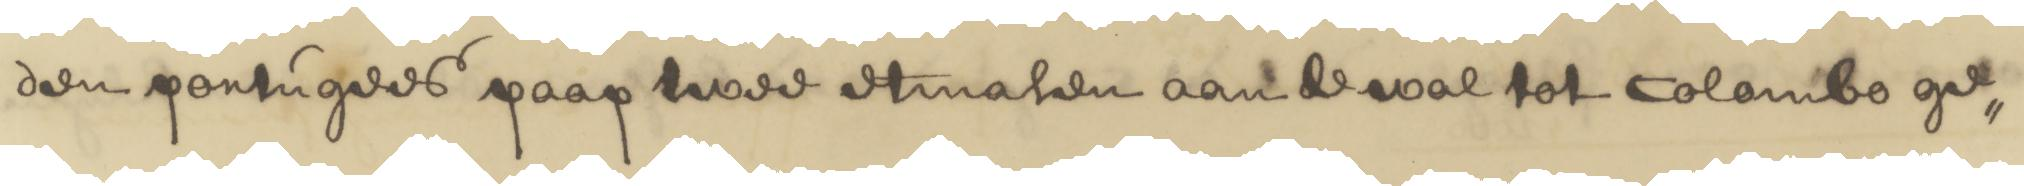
den portugees paap twee etmalen aan de wal tot colombo ge„
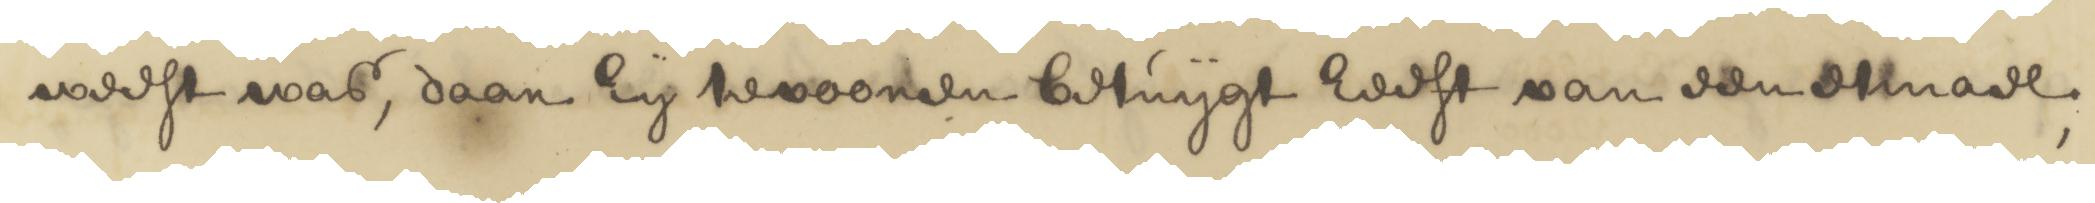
weest was, daar hij tevooren betuijgt heeft van een etmael,
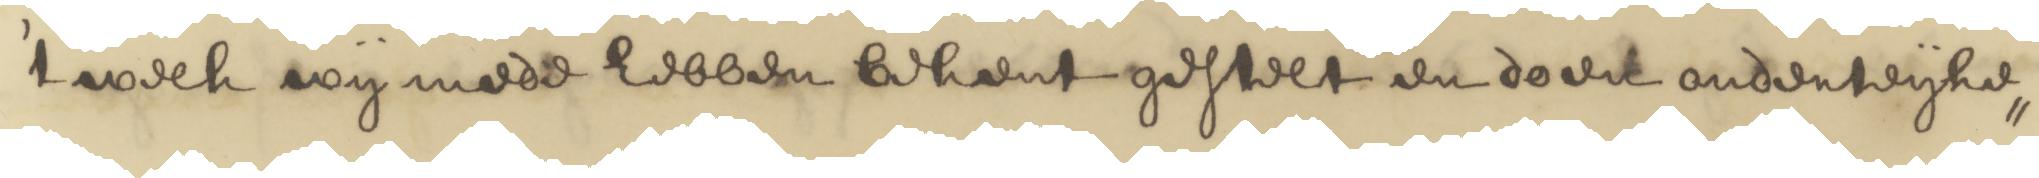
’t welk wij mede hebben bekent gestelt en doen onderteijke„
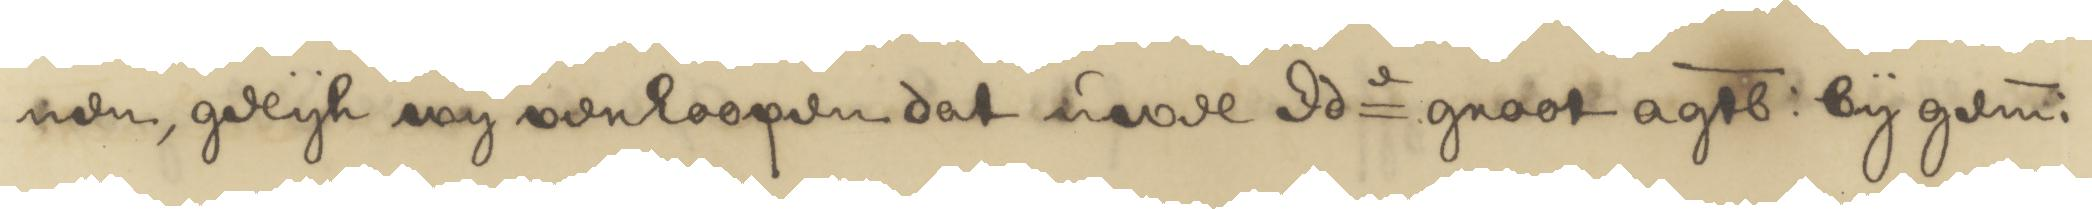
nen, gelijk wij verhoopen dat uwel Ed=e groot agtb: bij gem:
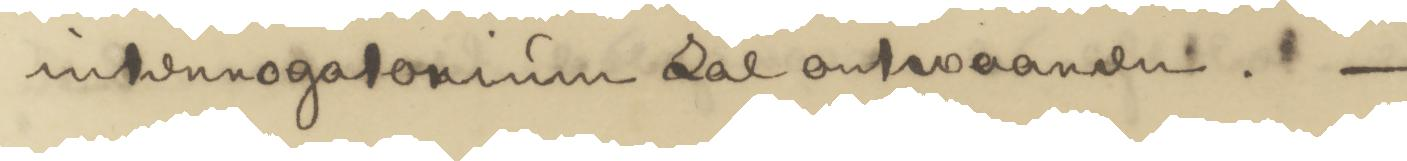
interrogatorium zal ontwaaren. —
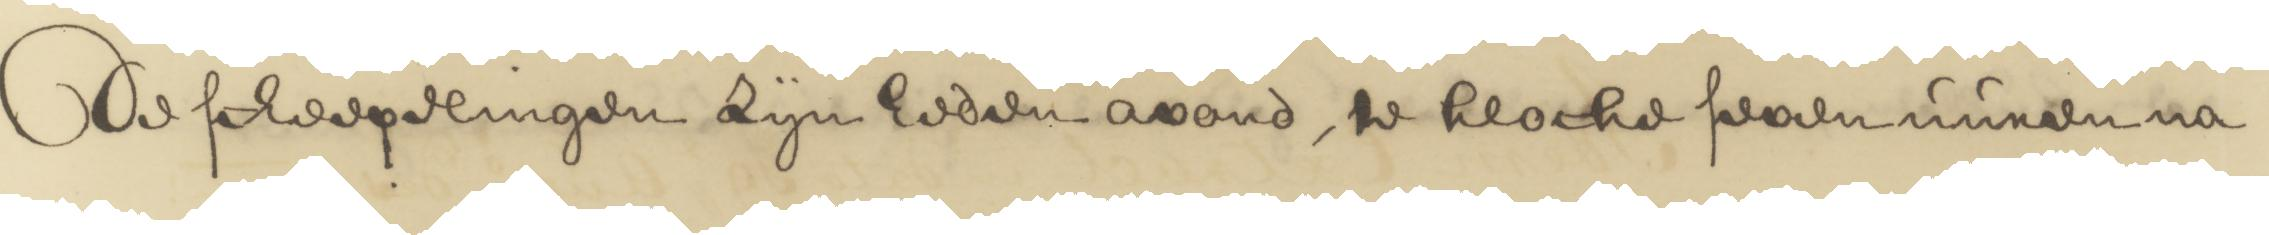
de scheepelingen zijn heden avond, te klocke seven uuren na
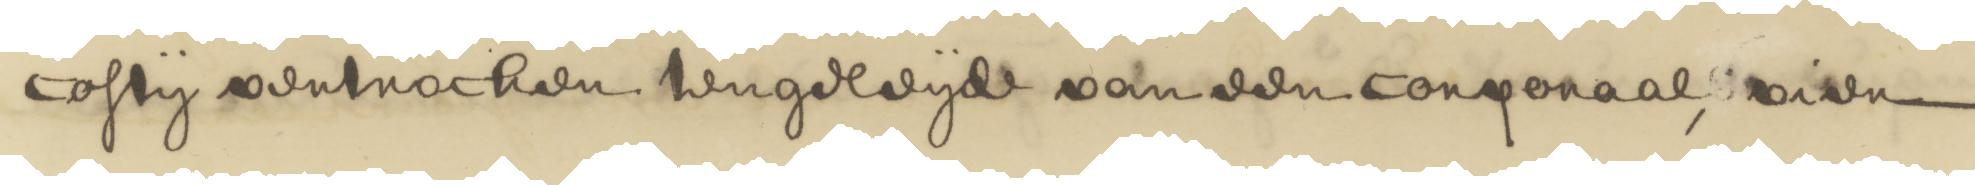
costij vertrocken tengeleijde van een corporaal, vier
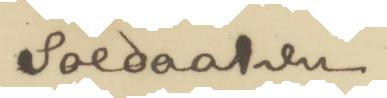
soldaaten
